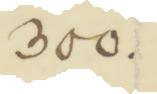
300.
